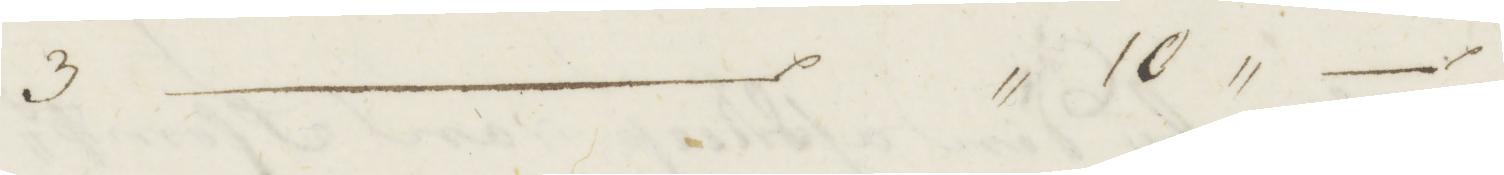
3 _o „ 10 „ _o
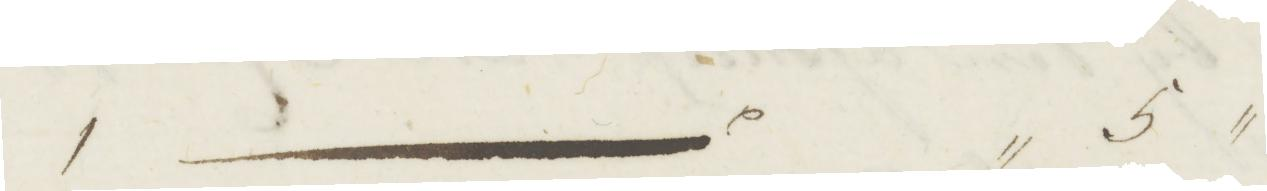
1 _o „ 5 „
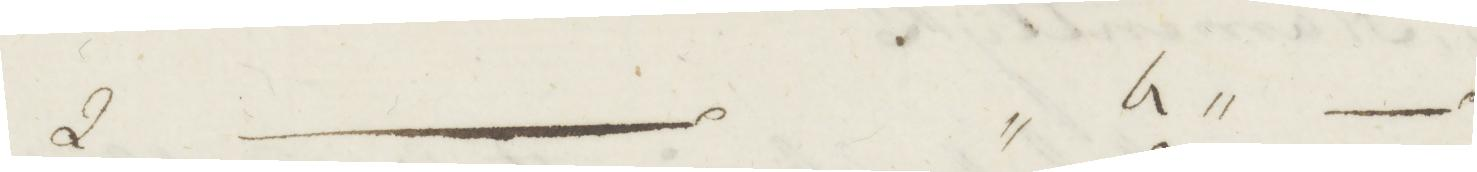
2 _o „ 4 „ _o
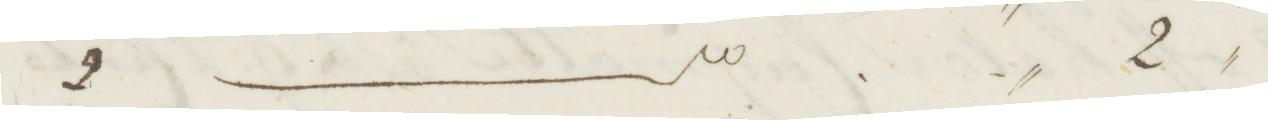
2 _o „ 2 „
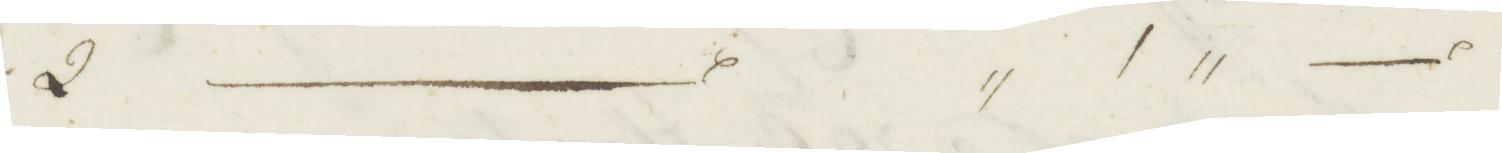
2 _o „1 „ _o
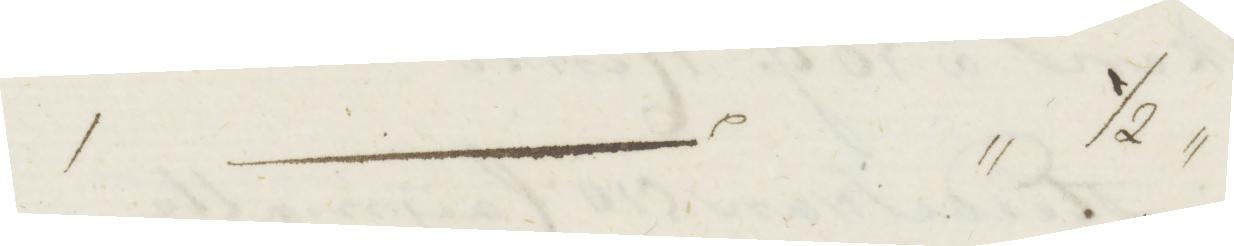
1 _o „ ½ „
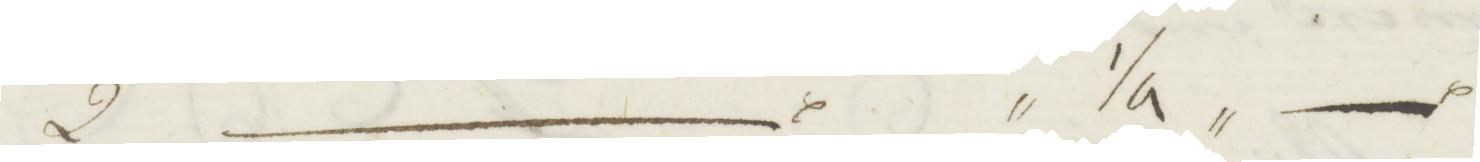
2 _o „ ¼ „ _o
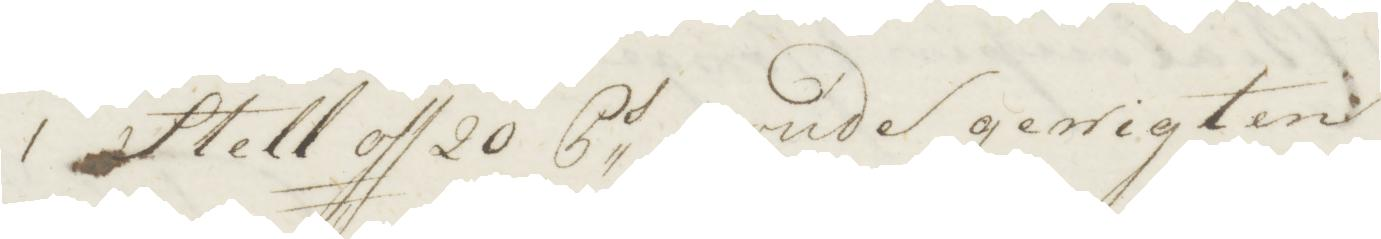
1 stell off 20 P„s goude gewigten
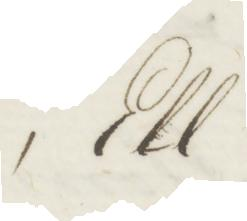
1 Ell
